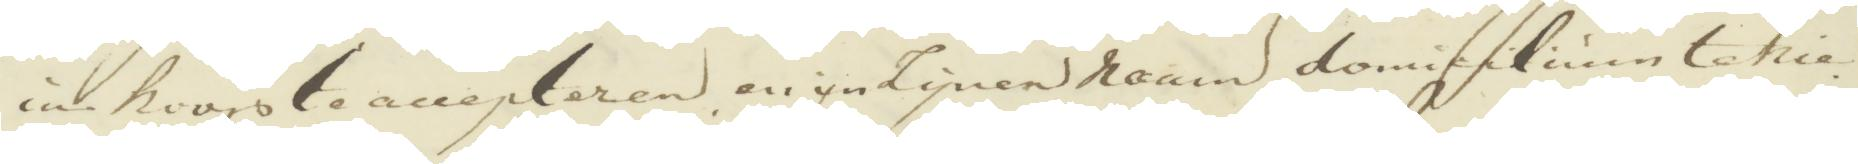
in koop te accepteren, en in zijnen naam domicilium te kie„
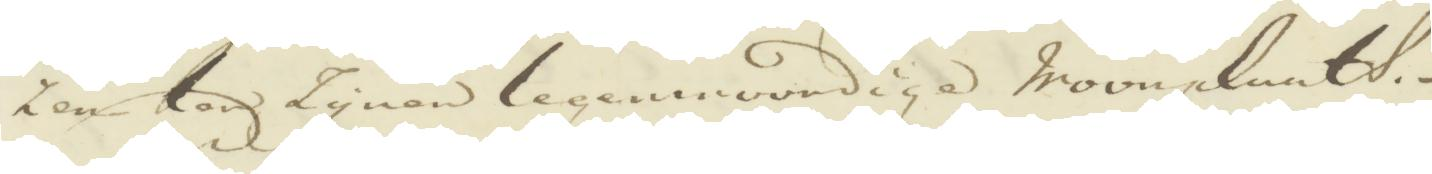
zen ten zijnen tegenwoordige woonplaats.
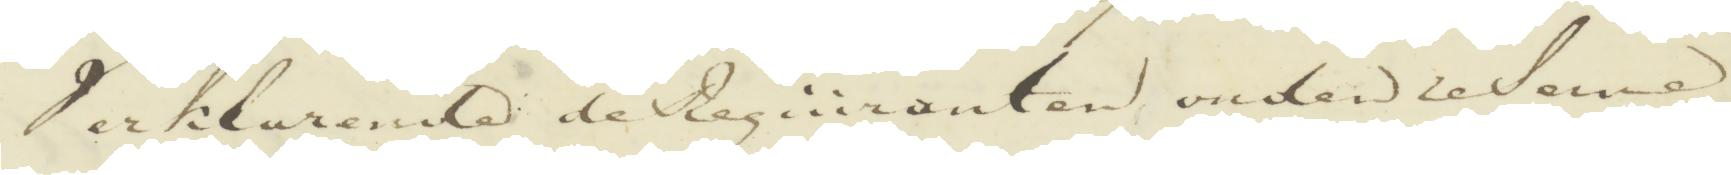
Verklarende de Requiranten, onder reserve
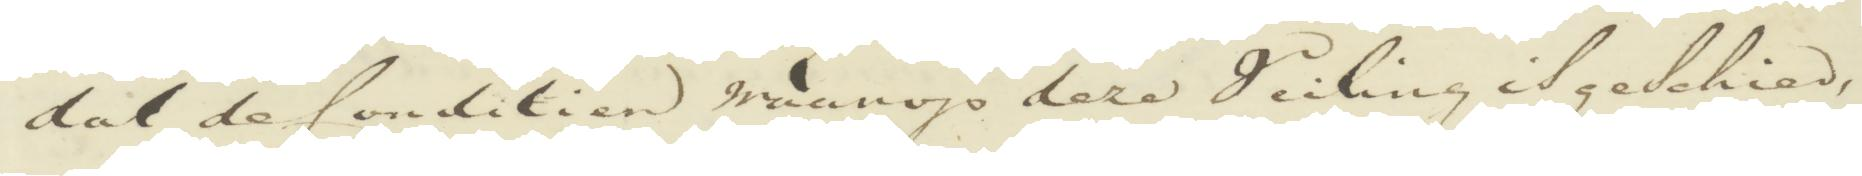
dat de Conditien waarop deze Veiling is geschied,
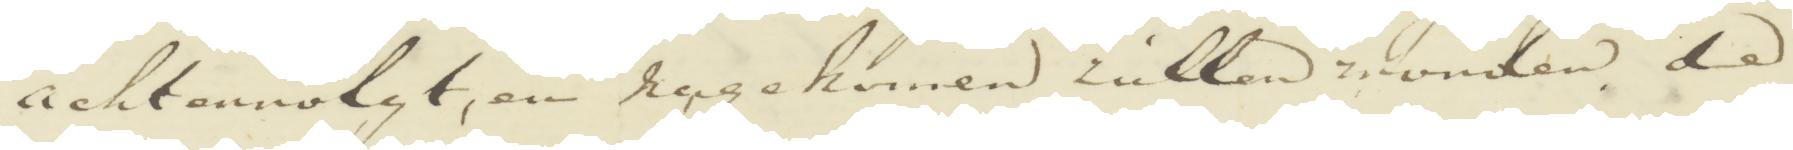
achtervolgt, en nagekomen zullen worden, de
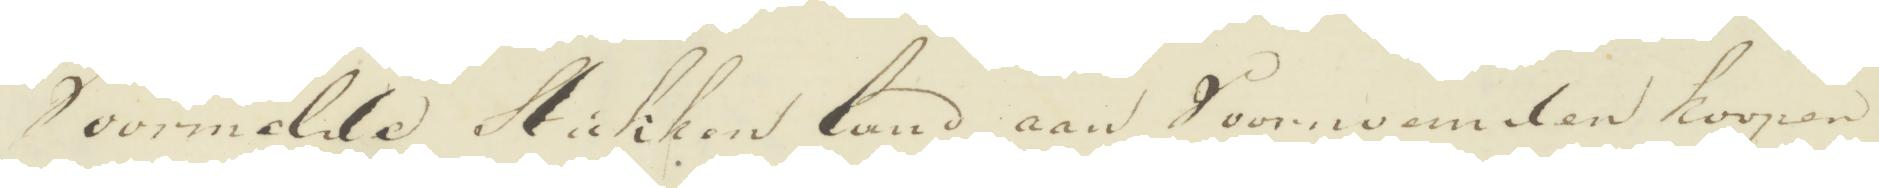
Voormelde stukken land aan Voornoemden kooper
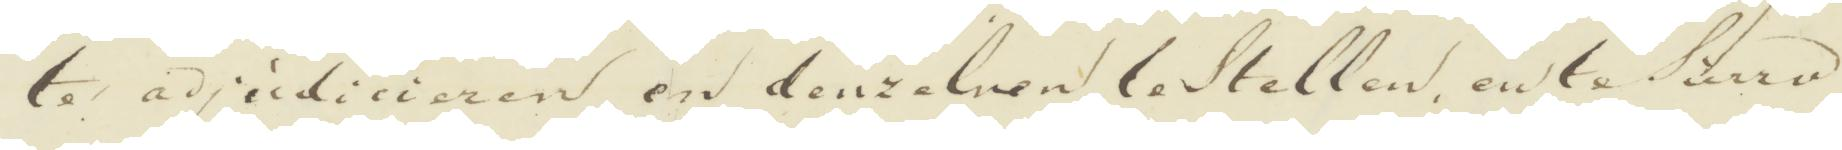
te adjudicieren, en denzelven te stellen, en te surro
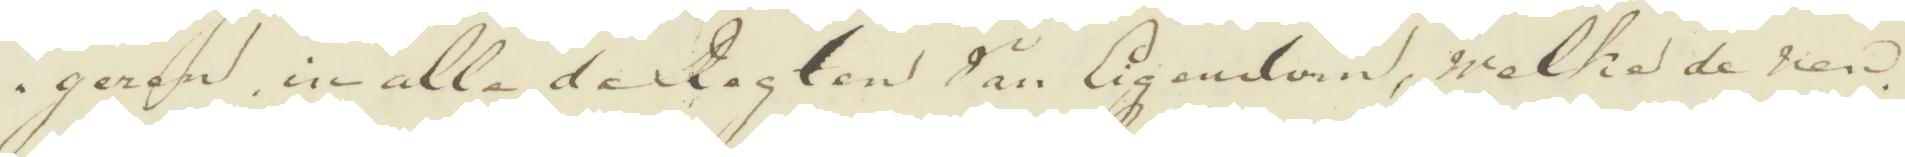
„geren, in alle de Regten van Eigendom, welke de ver„
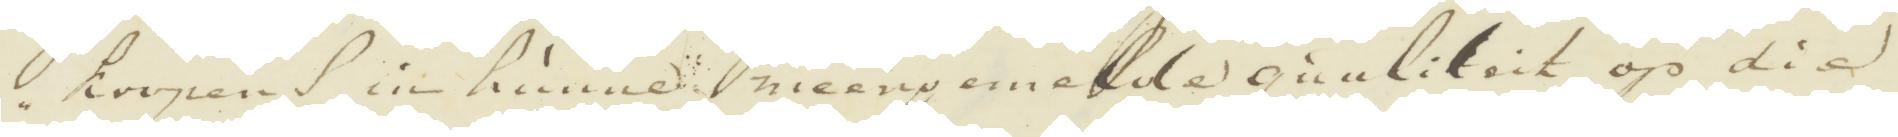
„ koopers in hunne meergemelde qualiteit, op die
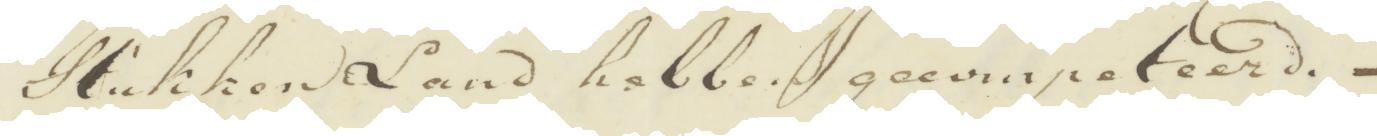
stukken Land hebben gecompeteerd.
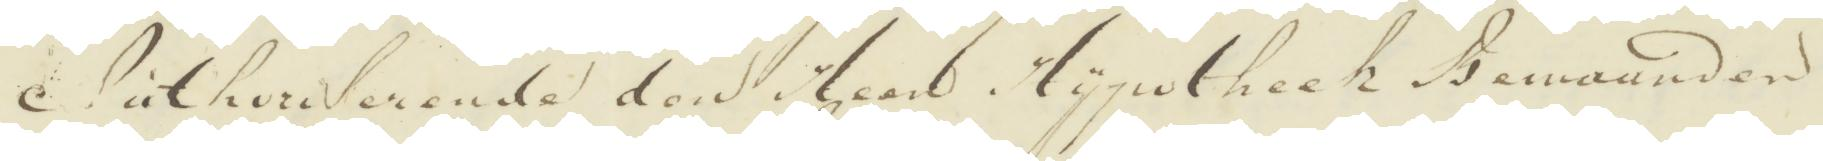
Authoriserende den Heer Hijpotheek Bewaarder
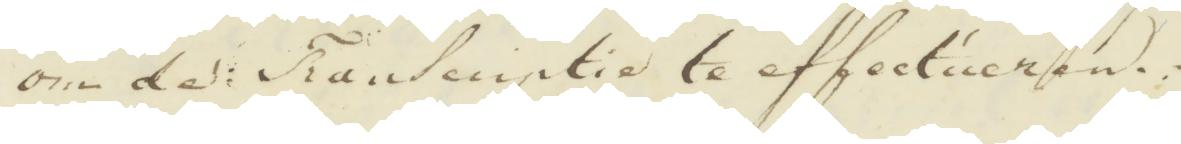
om de Transcriptie te effectueren.
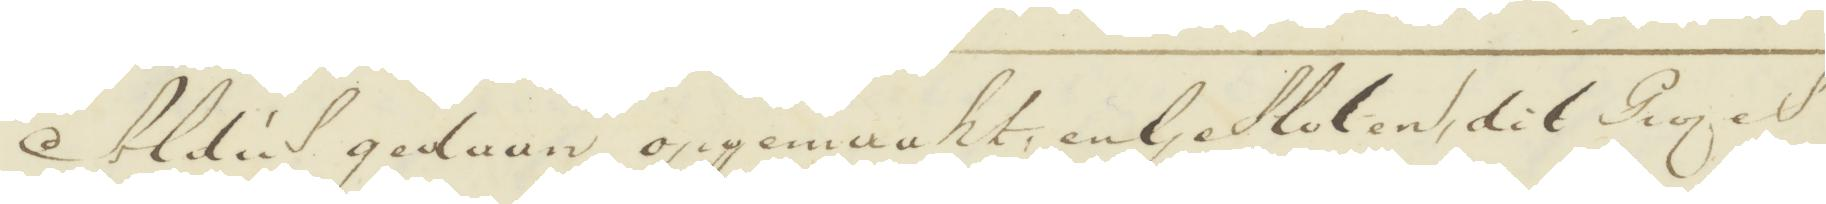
Aldus gedaan opgemaakt en Gesloten, dit Proces
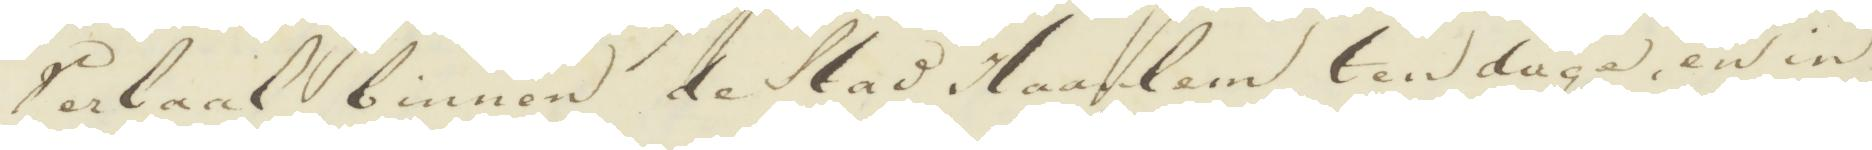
Verbaal binnen de stad Haarlem ten dage, en in
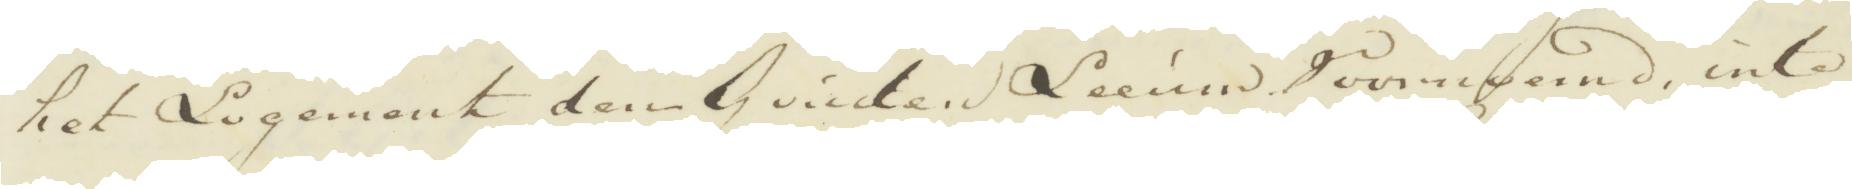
het Logement den Gouden Leeuw Voornoemd, inte
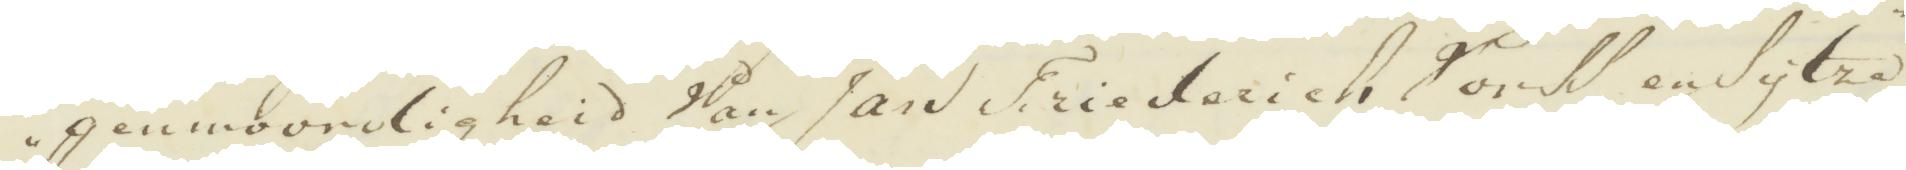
„genwoordigheid van Jan Friederich Vorss, en Sijtze
